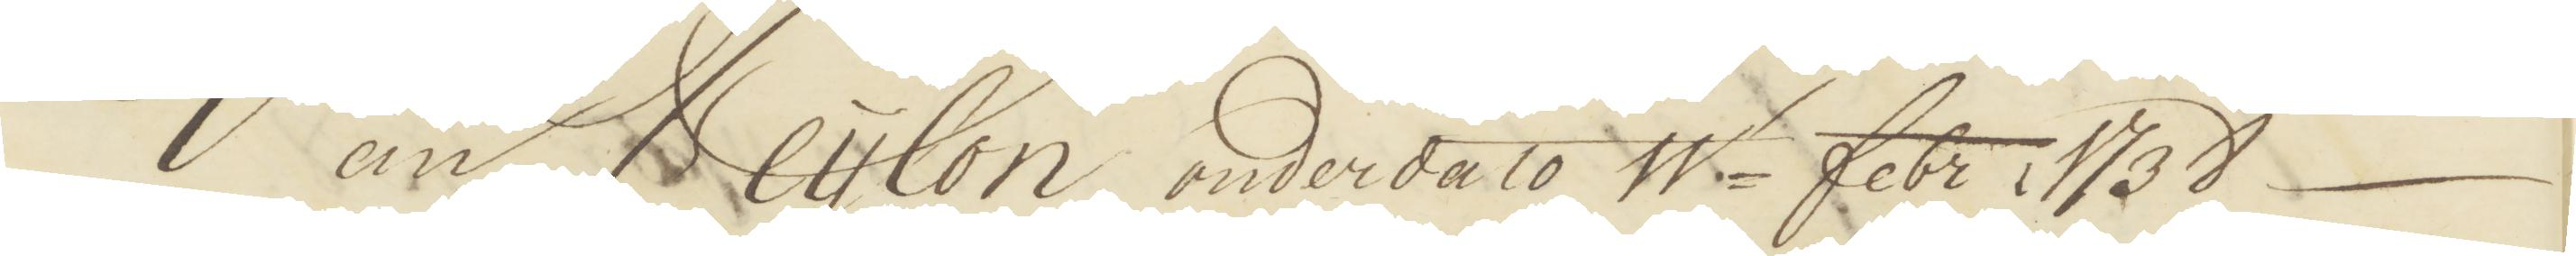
Van Ceijlon onder dato 11'= febr: 1738 —
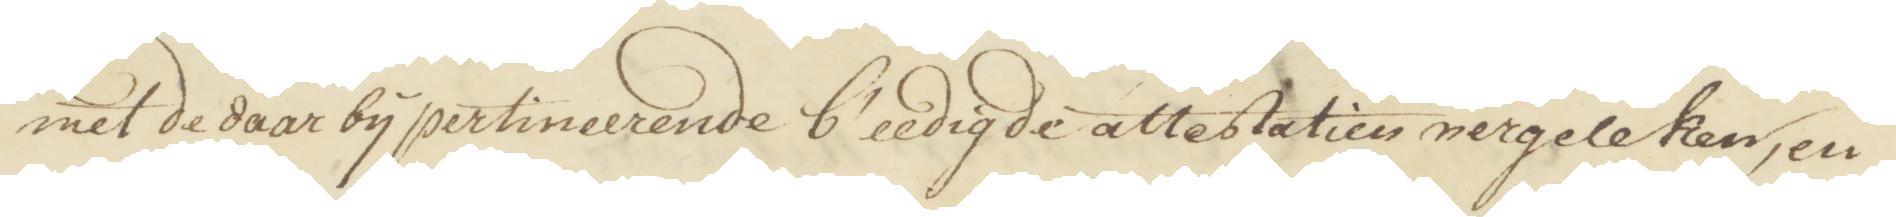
met de daar bij pertineerende b'eedigde attestatien vergeleken, en
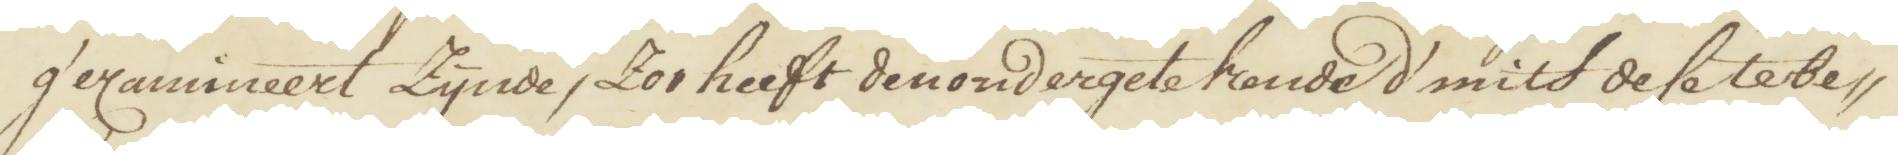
g'examineert zijnde, zoo heeft den ondergetekende d’ mits dese tebe„
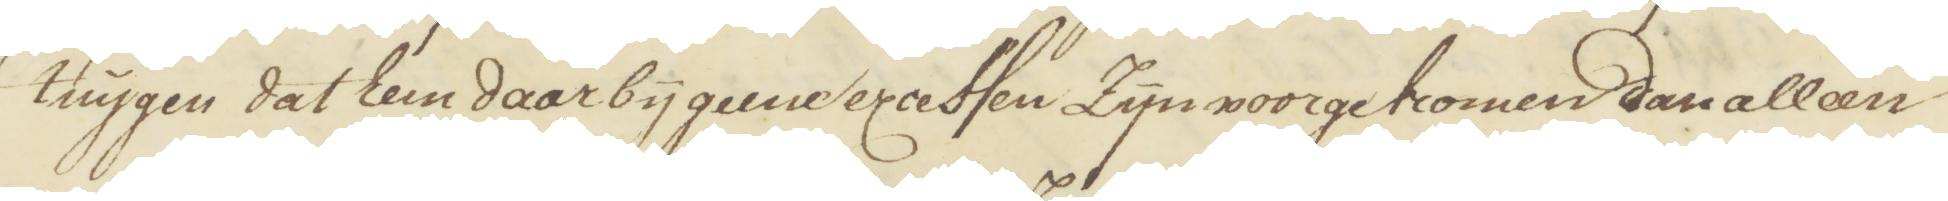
tuijgen dat hem daar bij geene excessen zijn voorgekomen dan alleen
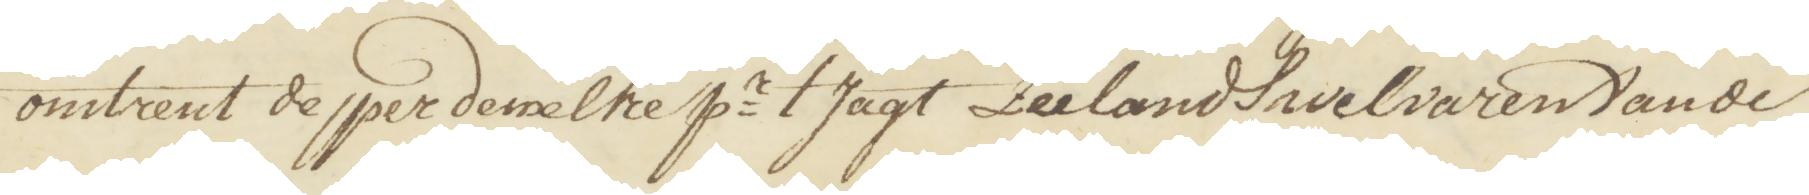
omtrent de pper dewelke p=r 't Jagt zeelands welvaren Vande
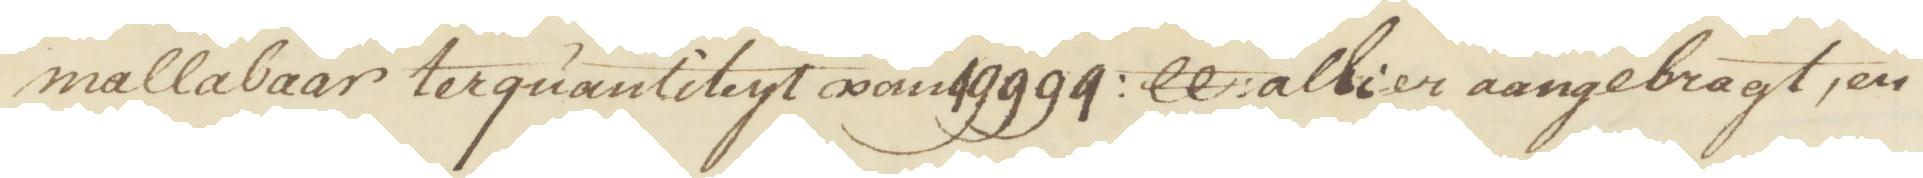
mallabaar ter quantiteyt van 49994: lb: alhier aangebragt, en
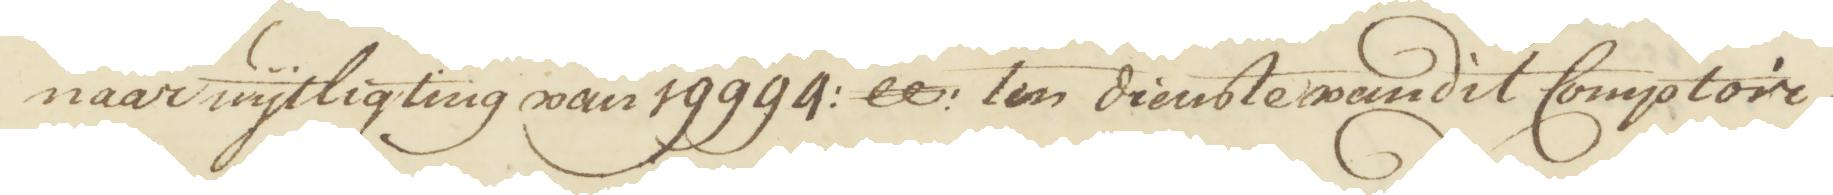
naar uijtligting van 19994: lb: ten dienste van dit Comptoir,
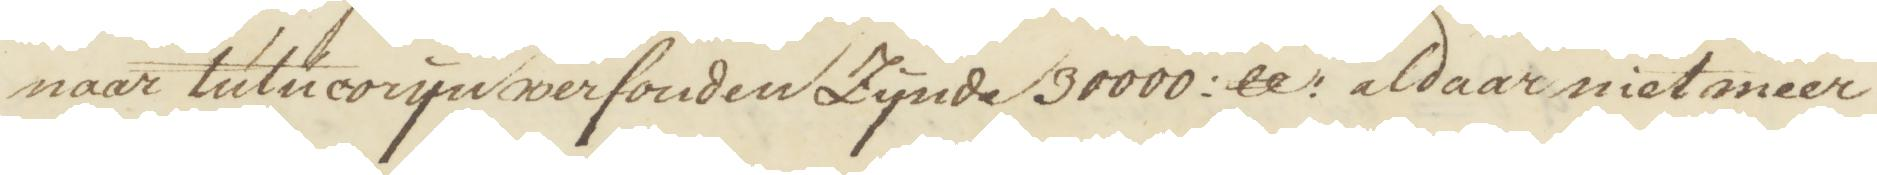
naar tutucorijn versonden zijnde 30000: lb: aldaar niet meer
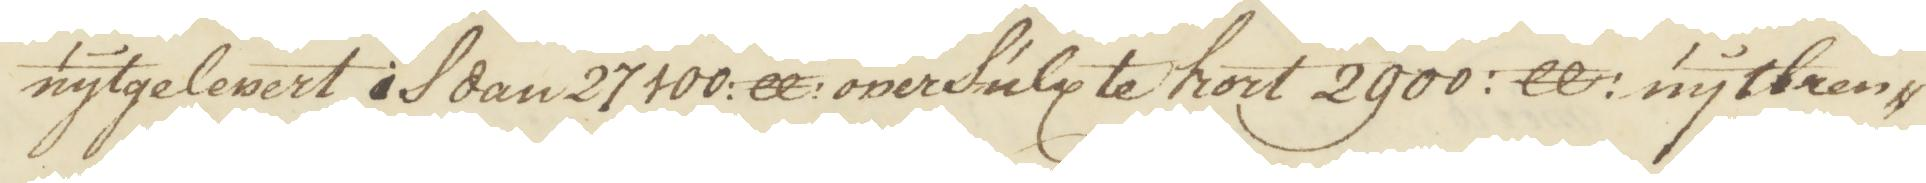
uijtgelevert is dan 27100: lb: oversulx te kort 2900: lb: uijtbren„
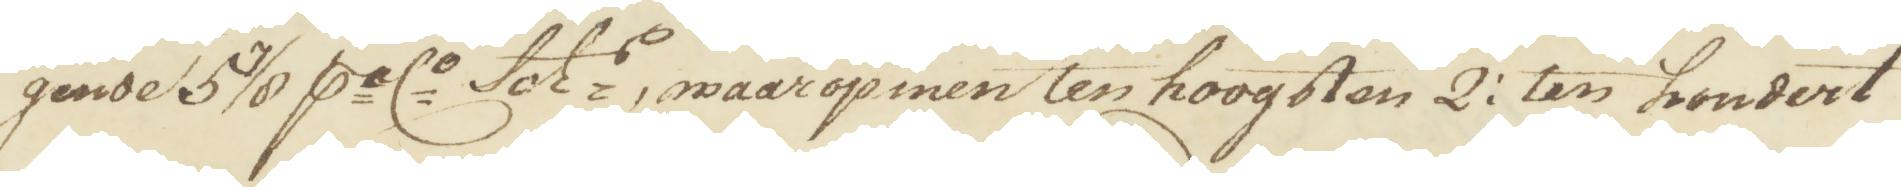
gende 5 7/8 p=r C=o Sch=s, waar op men ten hoogsten 2: ten hondert
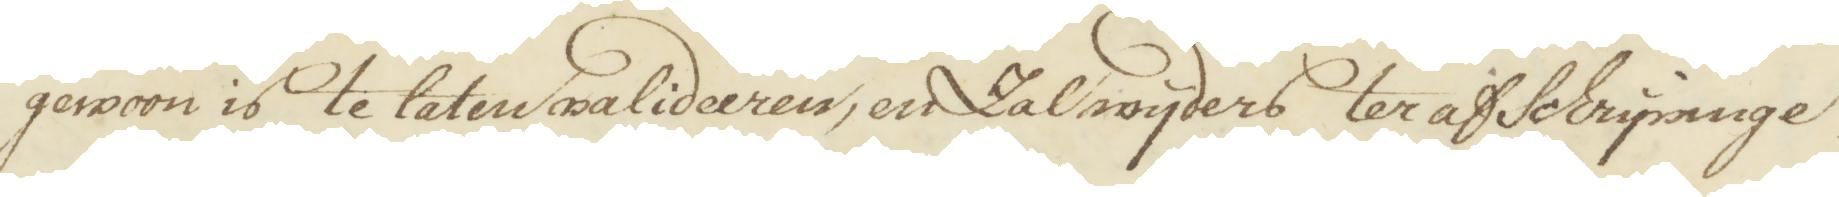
gewoon is te laten valideeren, en zal wijders ter afschrijvinge
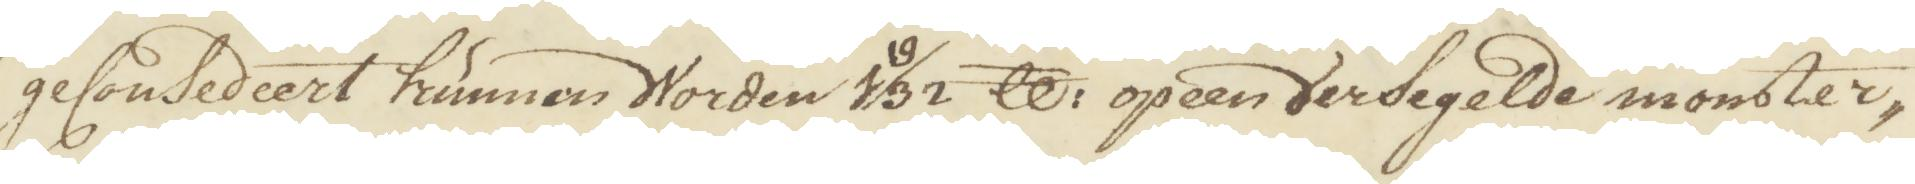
geconsedeert kunnen Worden 1 19/32 lb: op een versegelde monster„
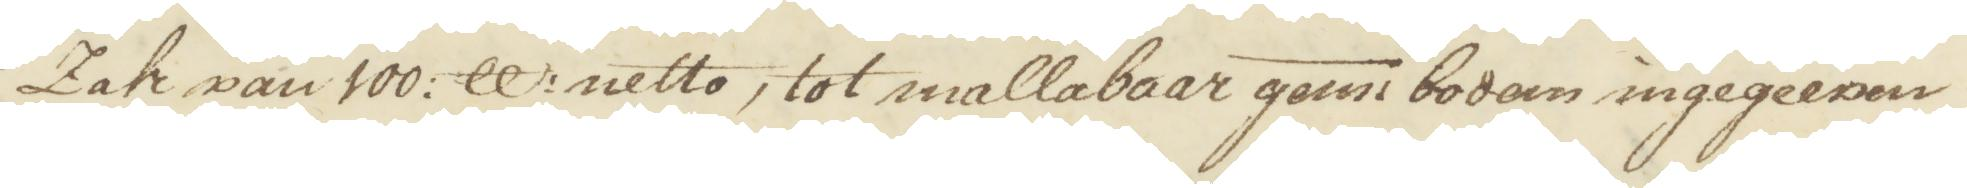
zak van 100: lb: netto, tot mallabaar gem: bodem ingegeeven
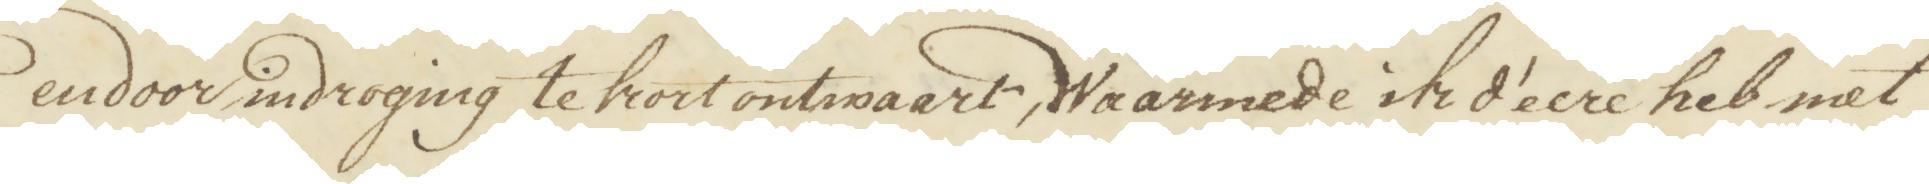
en door indroging te kort ontwaart, Waarmede ik d’eere heb met
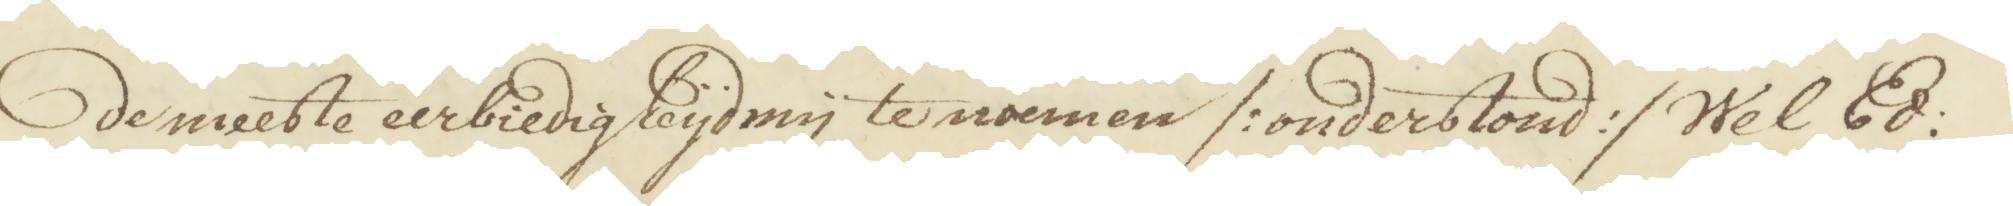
de meeste eerbiedigheijd mij te noemen /:onderstond:/ Wel Ed:
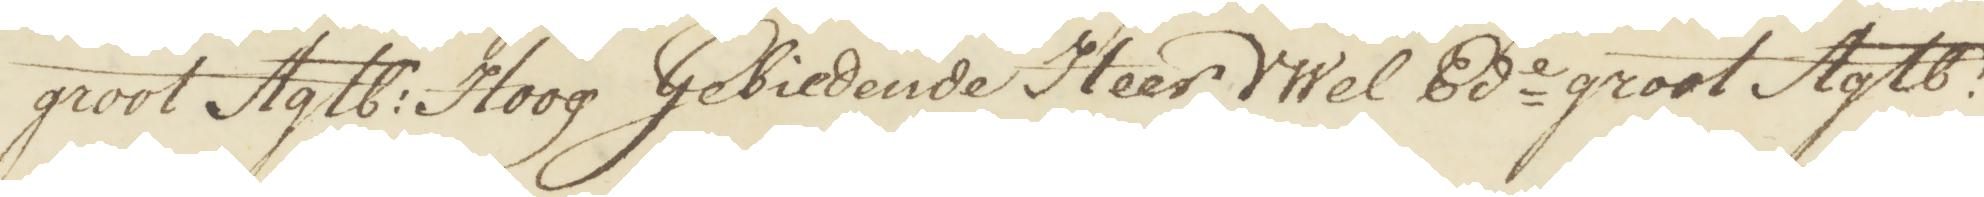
groot Agtb: Hoog Gebiedende Heer VWel Ed=e groot Agtb:
